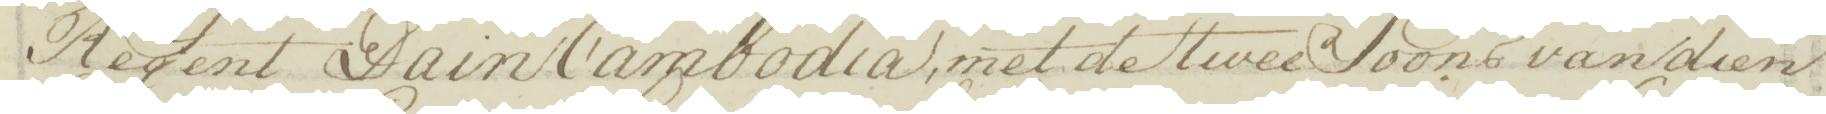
Regent Dain Cambodia, met de twee soons van dien
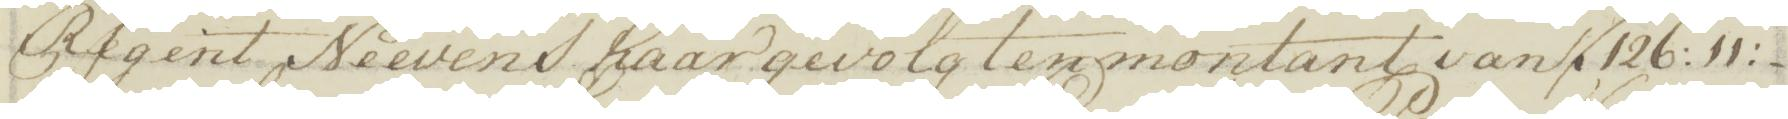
Regent Neevens haar gevolgten montant van ƒ126.11:-
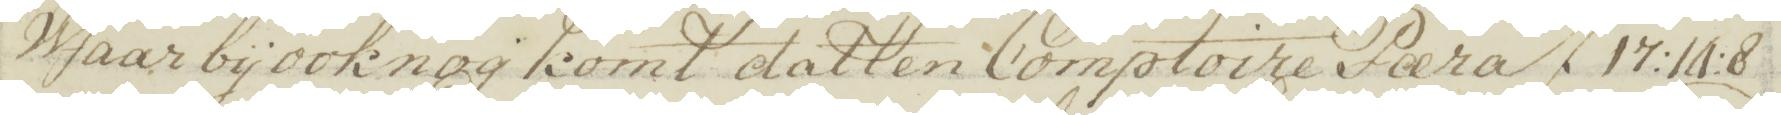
Waar bij ook nog komt datten Comptoire Poera ƒ17:14:8
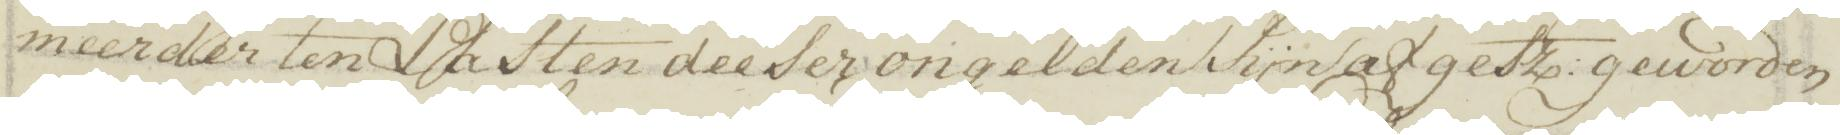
meerder ten Lasten deeser ongelden sijn afgesz: geworden
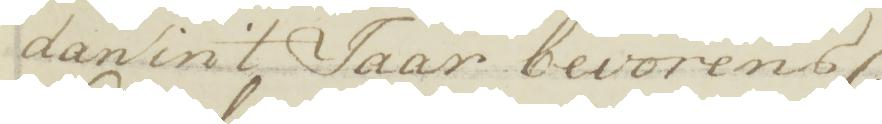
dan in 't Iaar bevorens
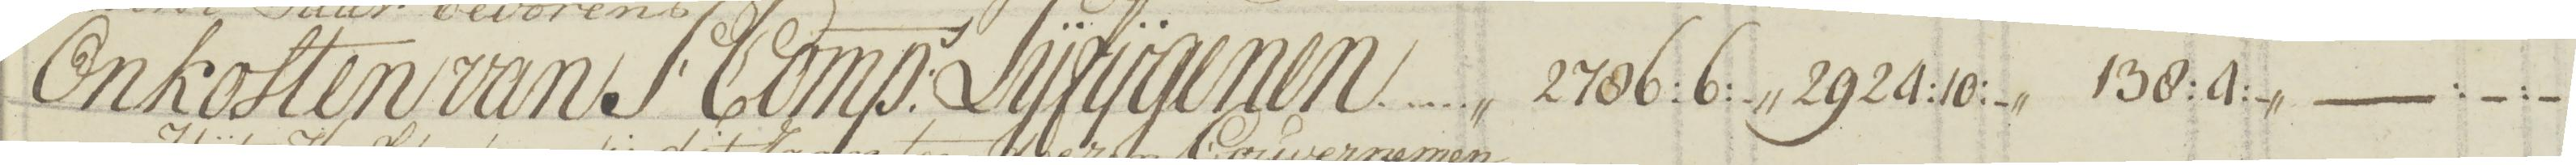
Onkosten van S' Comp:s Lijfijgenen ..... „ 2786:6: „2924:10:-„ 138: 4:-„ — : — : —
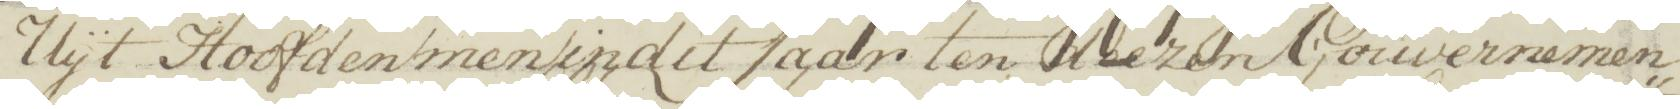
Uijt Hoofden men in dit Jaar ten deezen Gouvernemen„
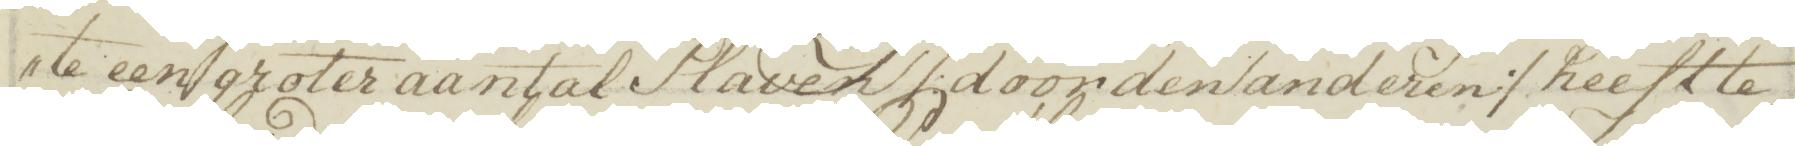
„te een groter aantal slaven /:door den anderen:/ heeft te
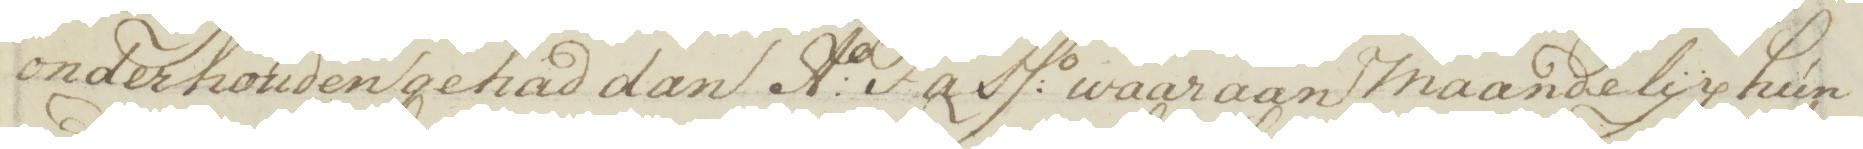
onderhouden gehad dan A:o Pass:o waar aan maandelijx hun
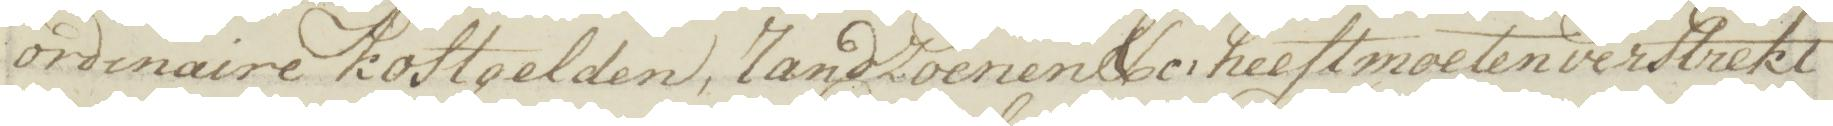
ordinaire kostgelden, randzoenen &c: heeft moeten verstrekt
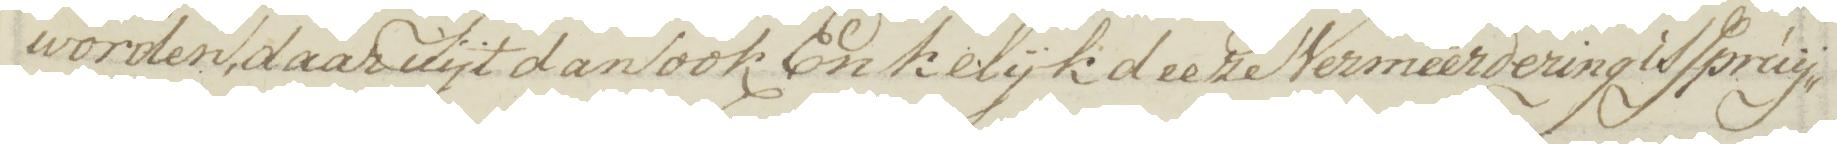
worden, daar uijt dan ook Enkelijk deeze Vermeerdering is spruij„
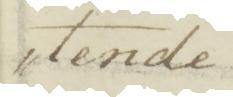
„tende.—
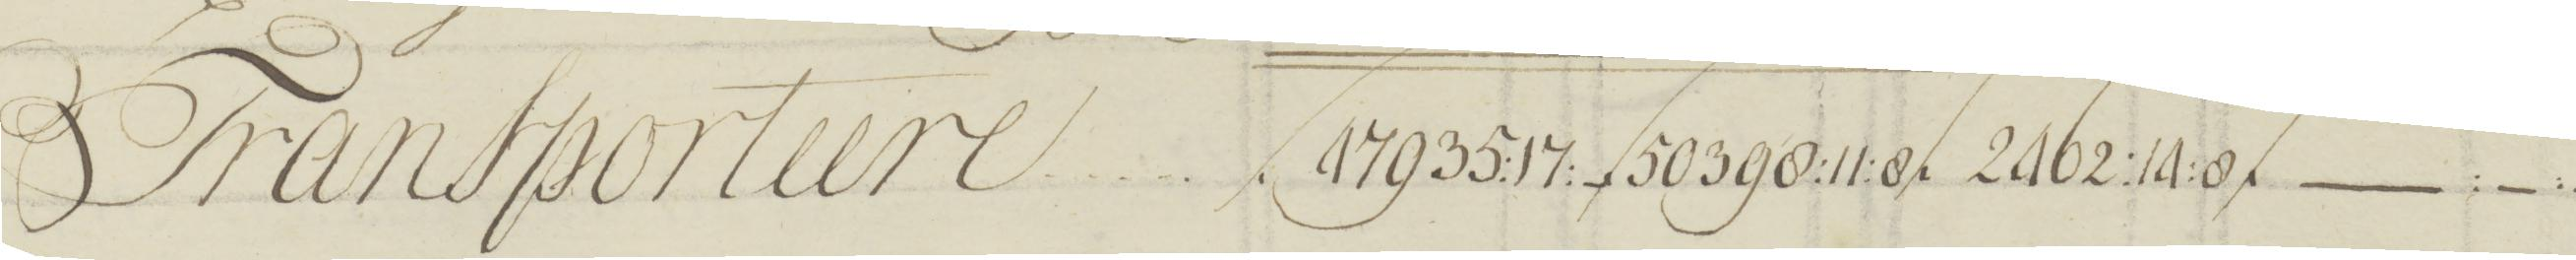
Transporteere . . . . . ƒ47935:17:- ƒ50398:11:8ƒ 2462:14:8ƒ —:—:
